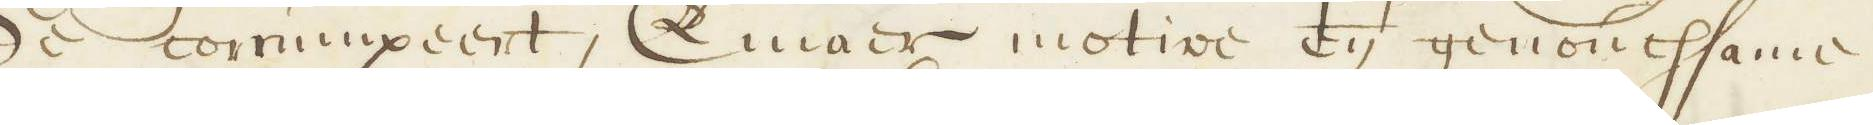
hoochste corrumpeert, maer motive en genouchsame
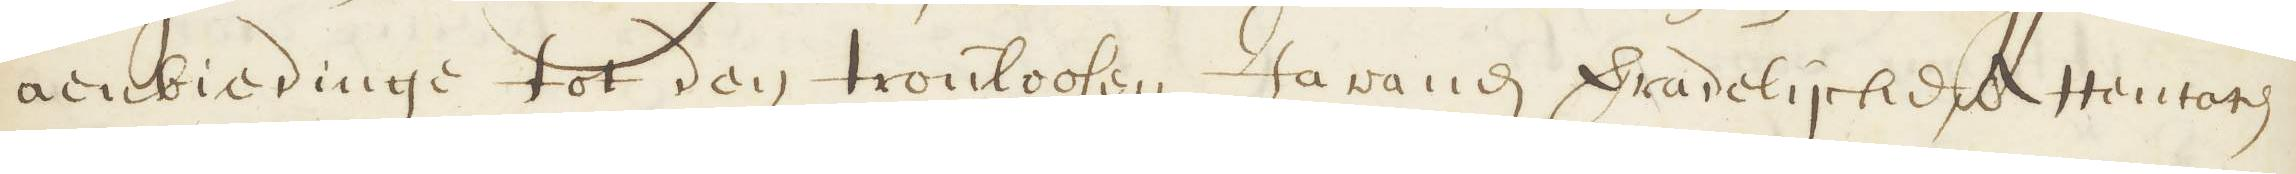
aenbiedinge tot den trouloosen Javanen verradelijcke, Attentaten
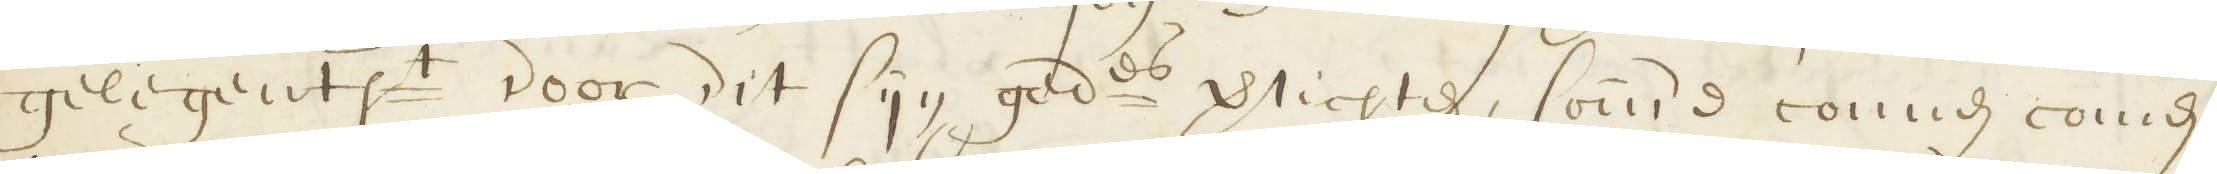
gelegenth=t door dit sijn ged=es vertichte, soude connen comen
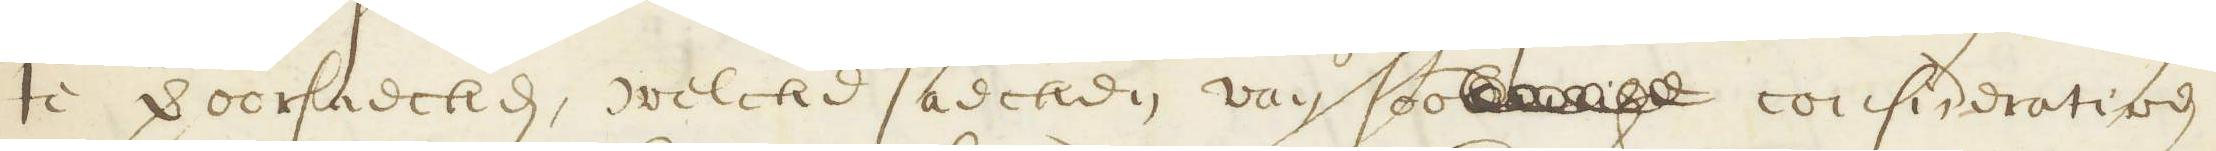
te veroorsaecken, welcke saecken van soodanige consideratien
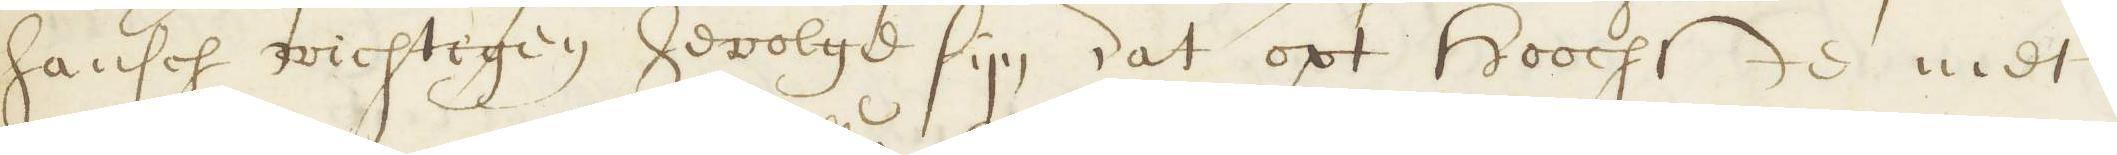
gansch wichtigen gevolge sijn dat opt hoochste met
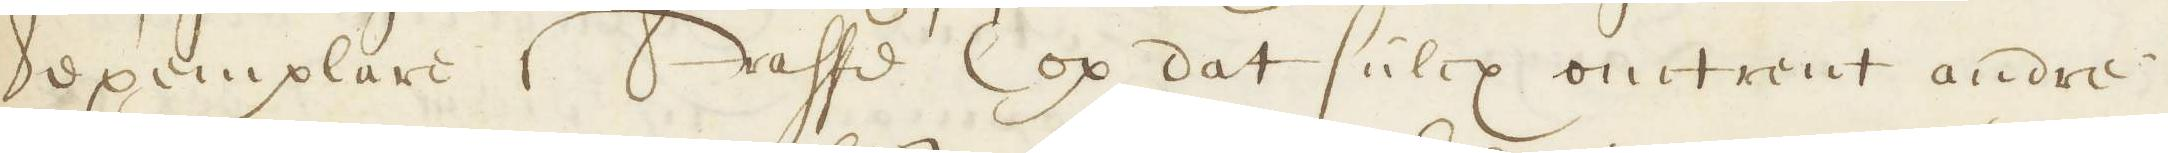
exemplare straffe (op dat sulcx omtrent andre
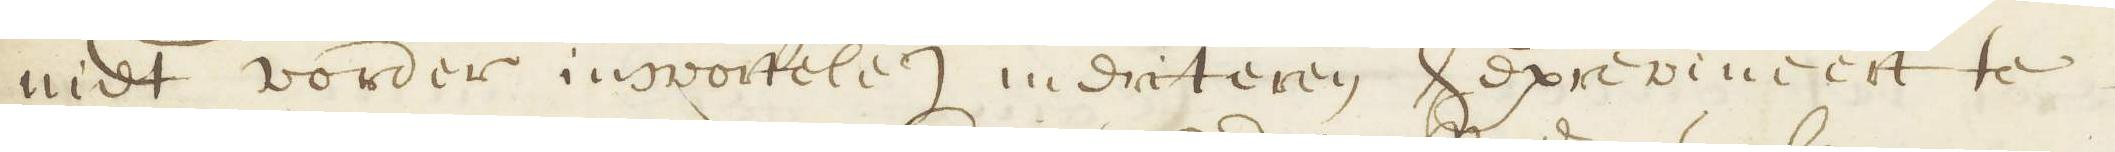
niet vorder inwortele) meriteren geprevineert te
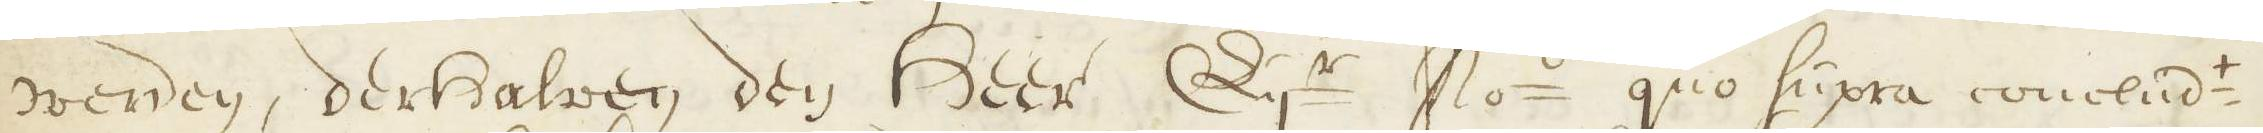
werden, derhalven den Heer Eij=r No=e quo supra conclud=t
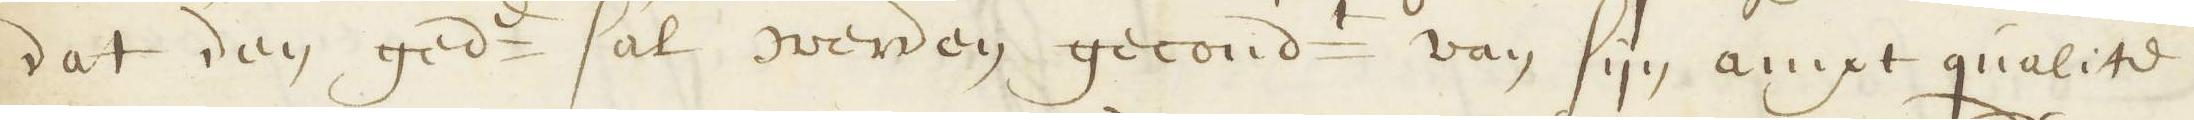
dat den ged=e sal werden gecond=t van sijn ampt qualite
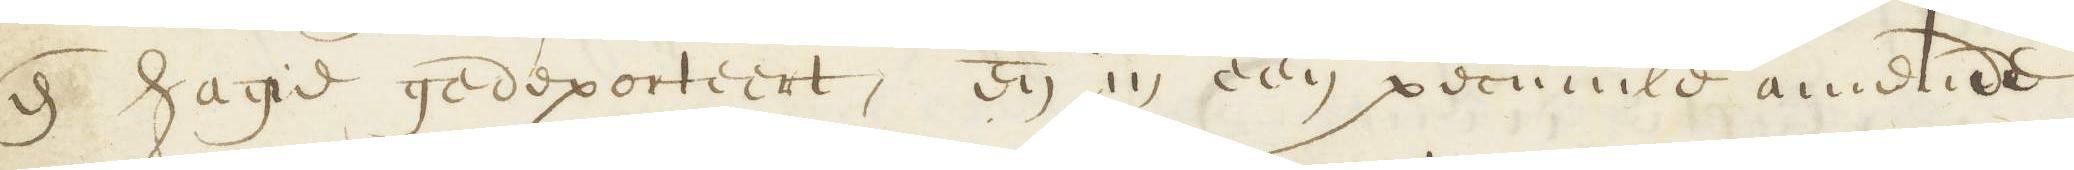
ende gagie gedeporteert, en in een pecunile ameide
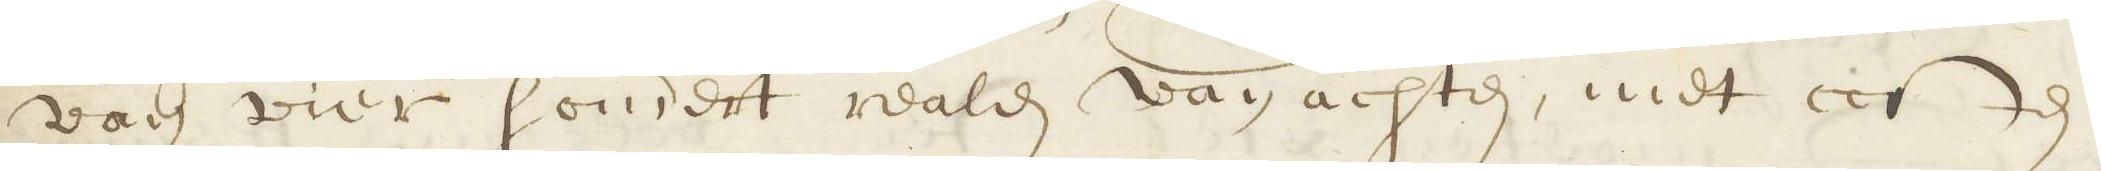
van vier hondert realen van achten, met costen
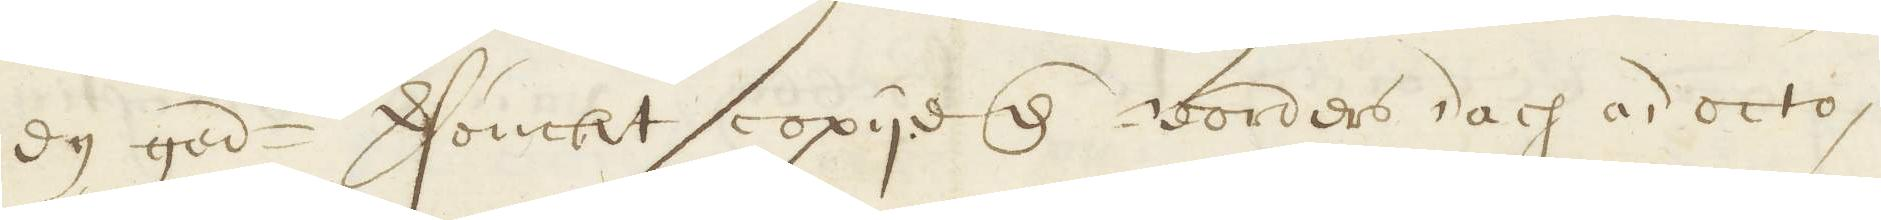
Den ged=t versouckt copije ende vorders dach ad octo,
